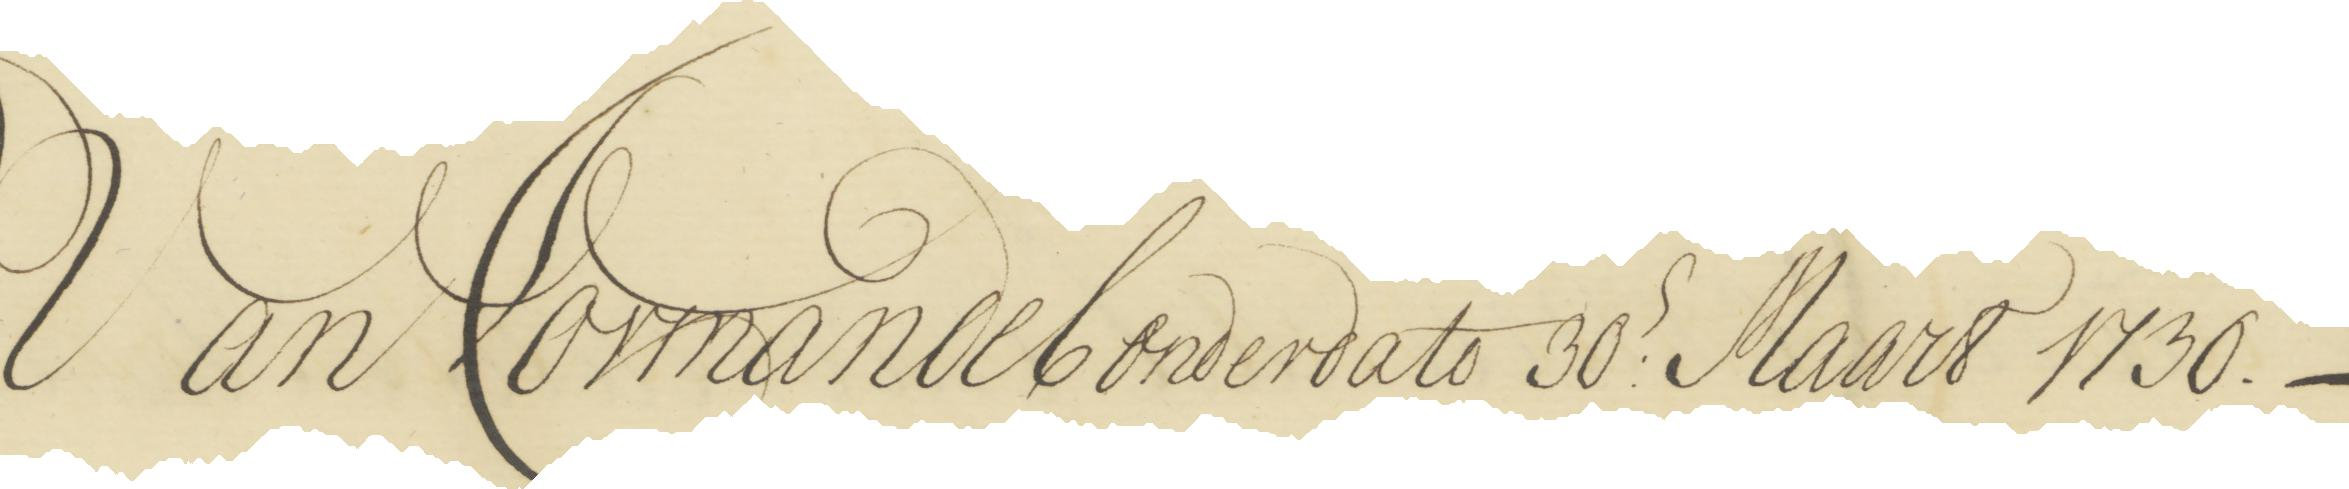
Van Cormandel onder dato 30:' Maart 1730. —
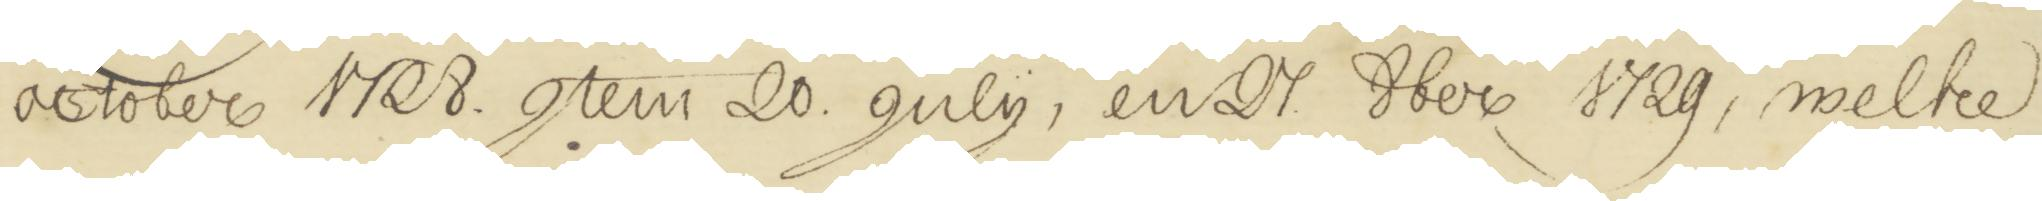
october 1728. jtem 20. julij, en 27. 8ber 1729, welke
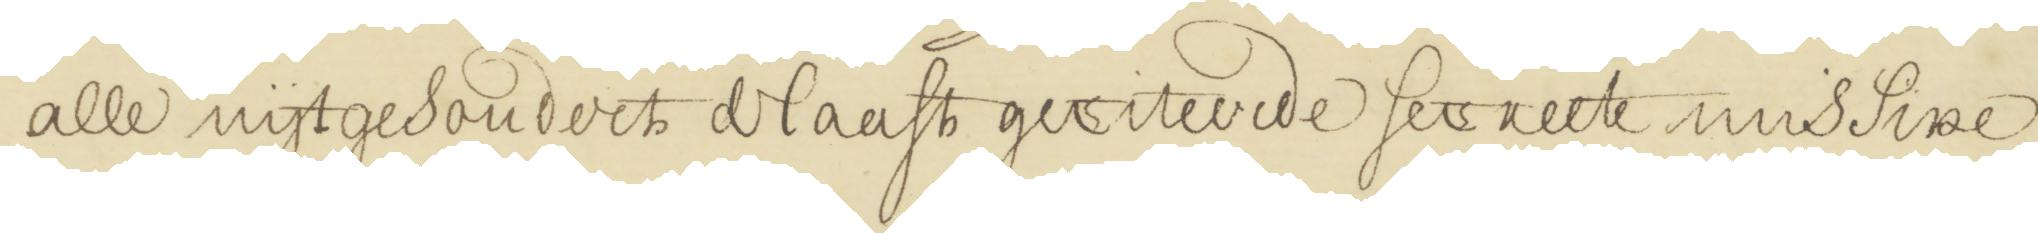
alle uijtgesondert de laast geciteerde secreete missive
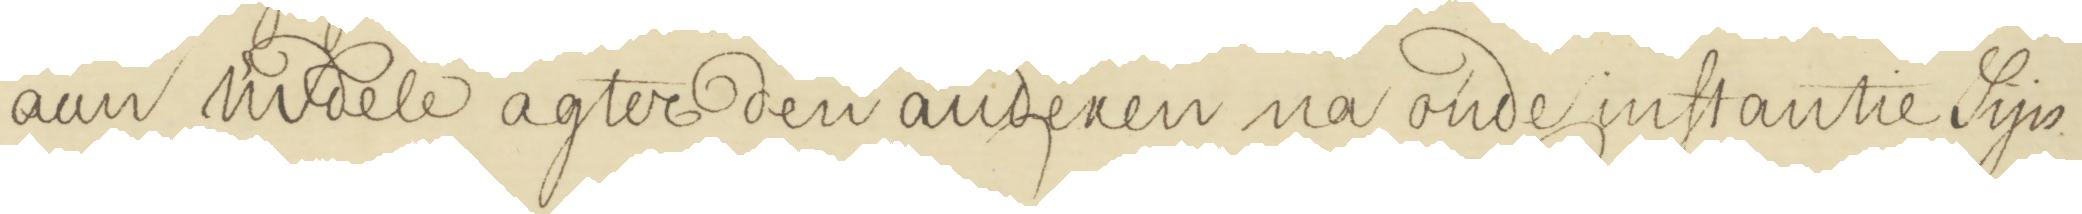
aan uEdele agter den anderen na oude instantie sijn
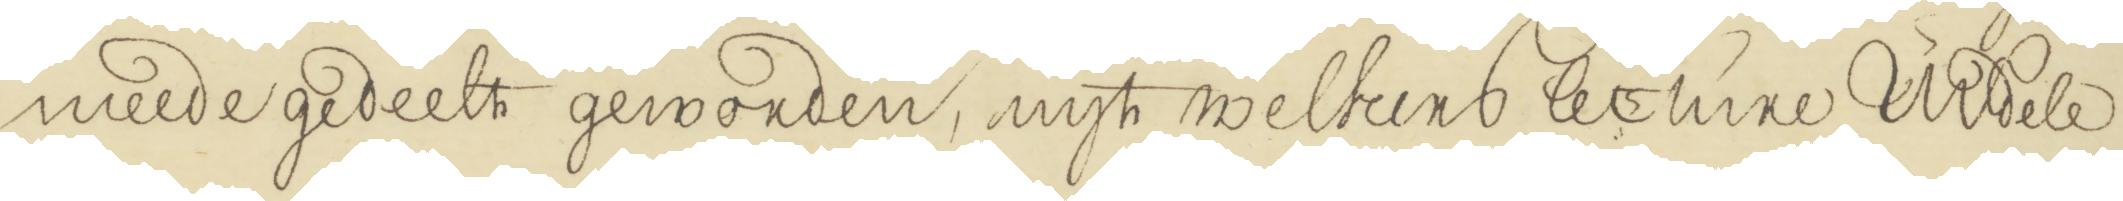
meede gedeelt geworden, uijt welkers lecture UEdele
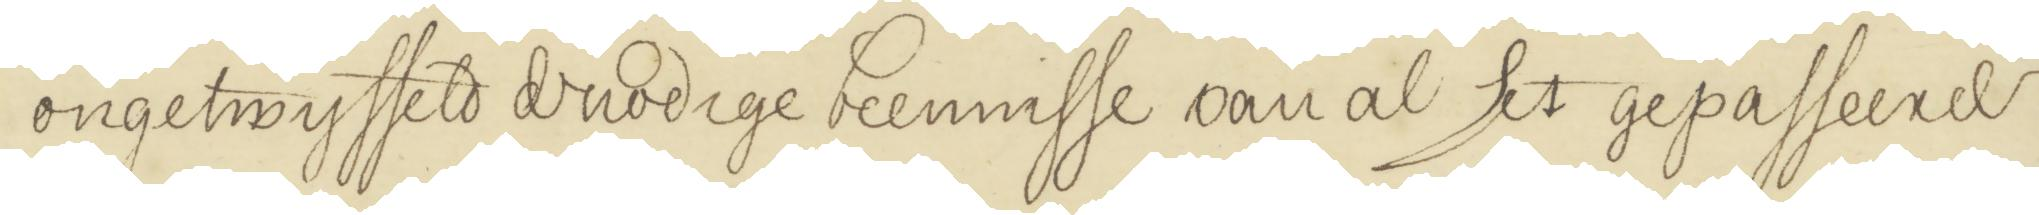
ongetwyffeld de nodige kennisse van al het gepasseerde
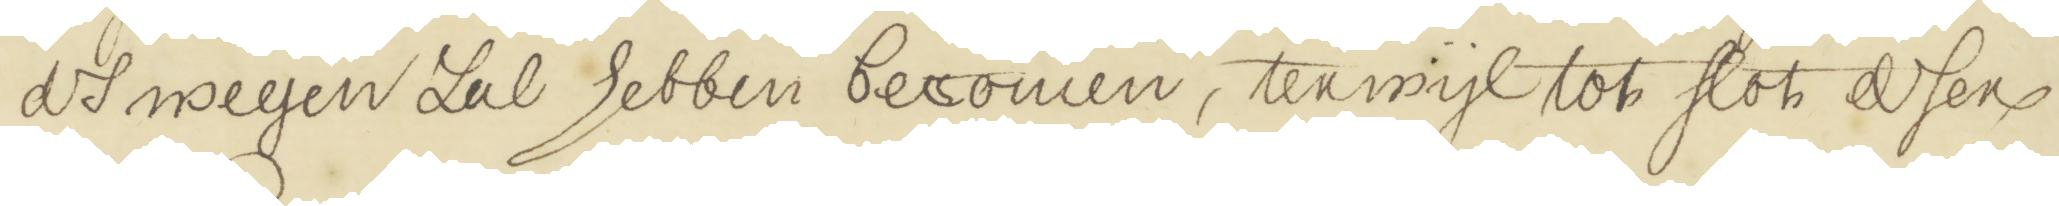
des wegen zal hebben becomen, terwijl tot slot deser
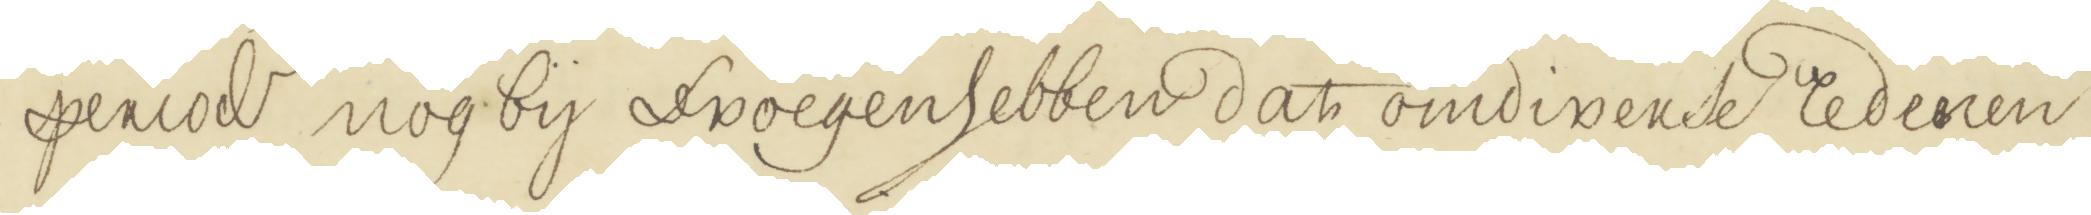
periode nog bij te voegen hebben dat om diverse redenen
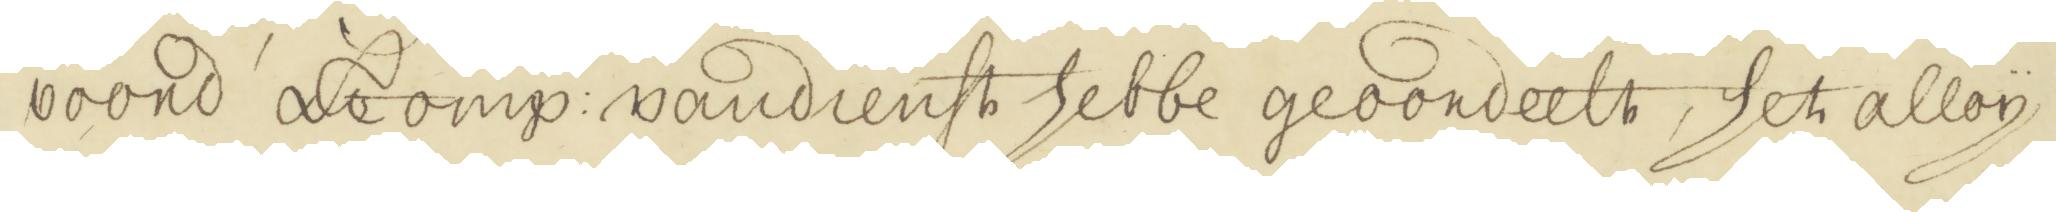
voord' Ecomp: van dienst hebbe geoordeelt, het alloij
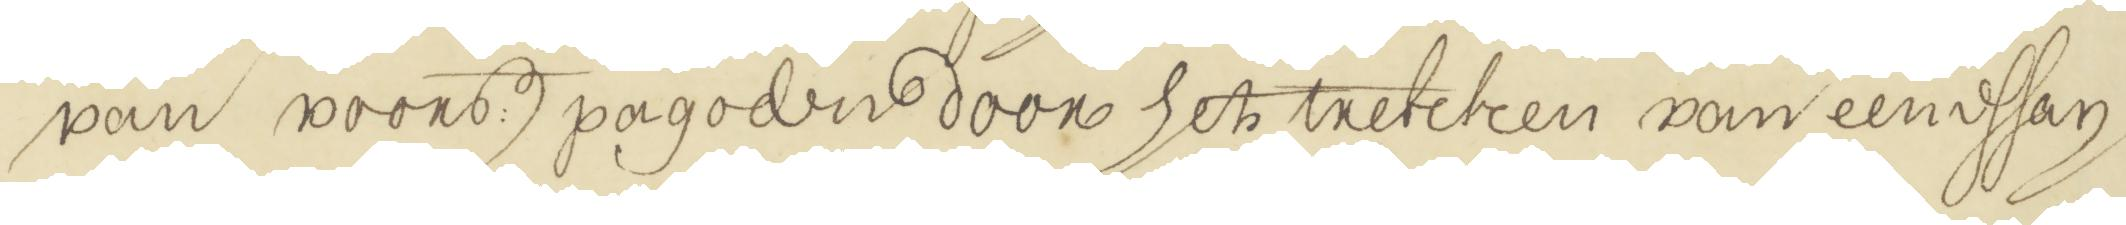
van voors: pagoden door het trekken van een essay
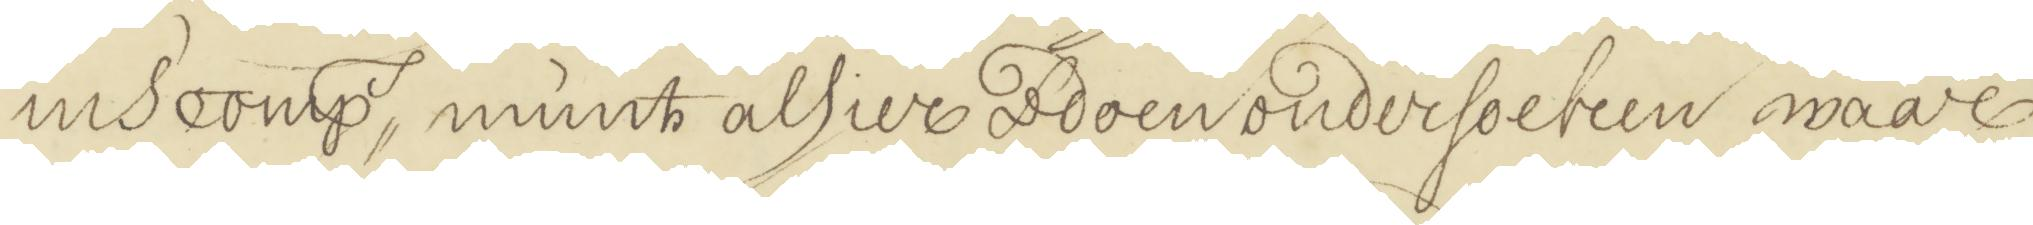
in s' comp„s munt alhier te doen ondersoeken waar
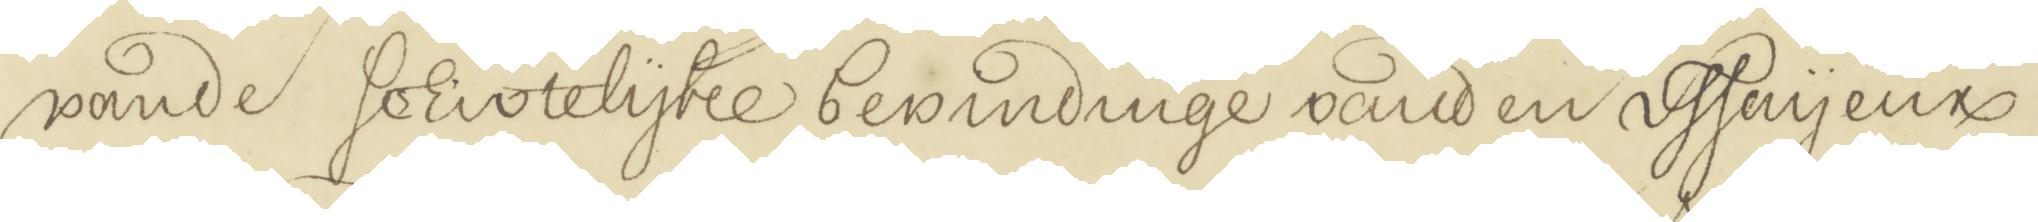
van de schivtelijke bevindinge vanden Essaijeur
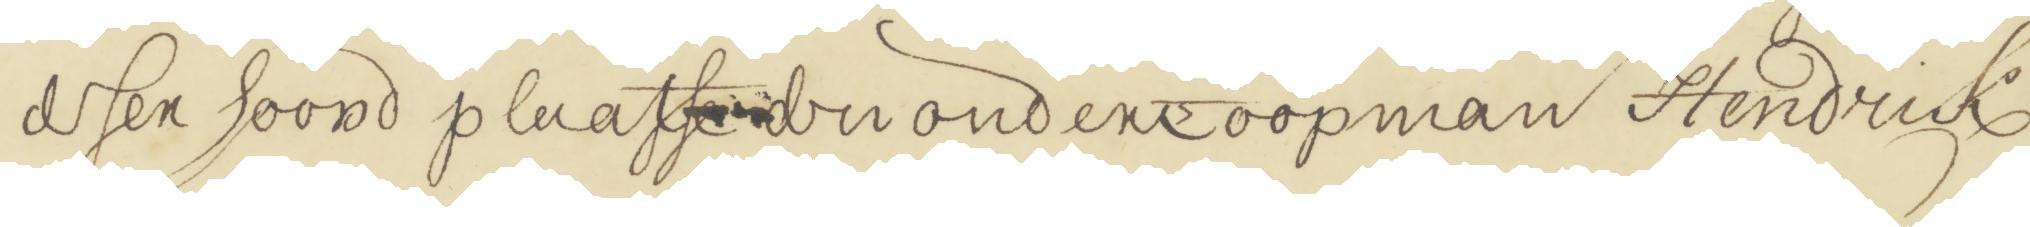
deser hoovd plaatse der ondercoopman Hendrick
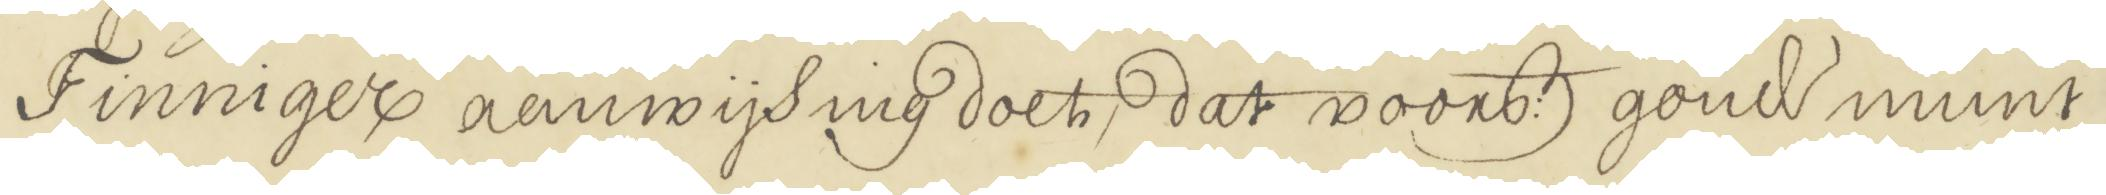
Finniger aanwijsing doet, dat voors: goude munt
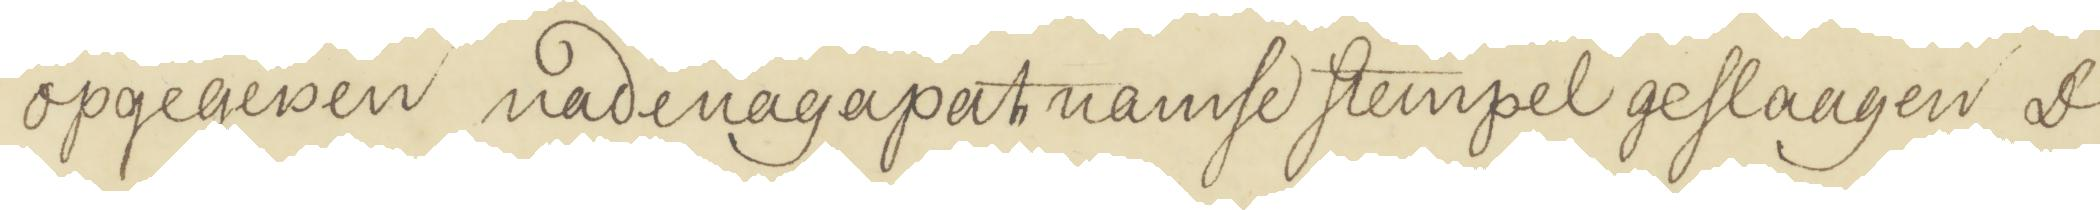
opgegeven nade nagapatnamse stempel geslaagen te
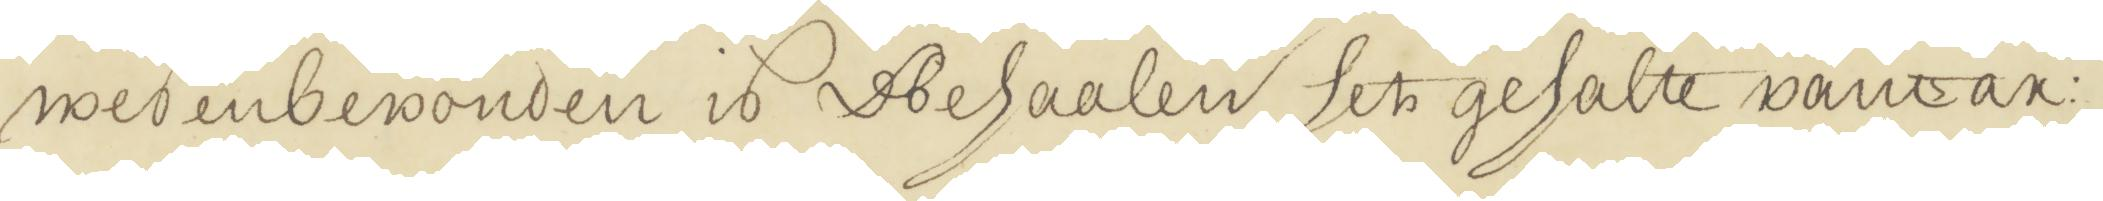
wesen bevonden is te behaalen het gehalte van car:
